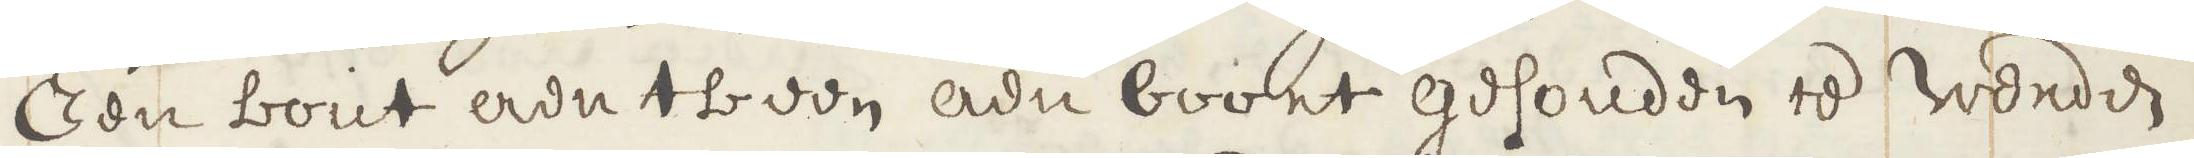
Een bout aen tbeen aen boort gesonden te werden
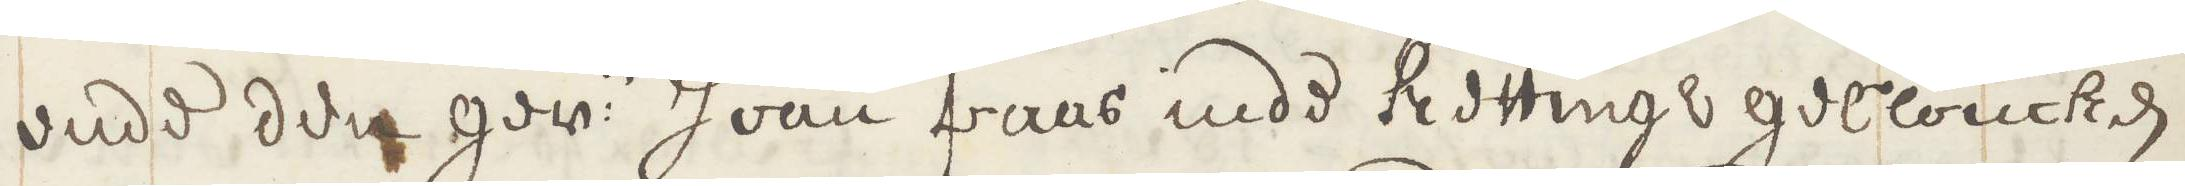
ende den gev: Joan paas inde kettingh gekloncken
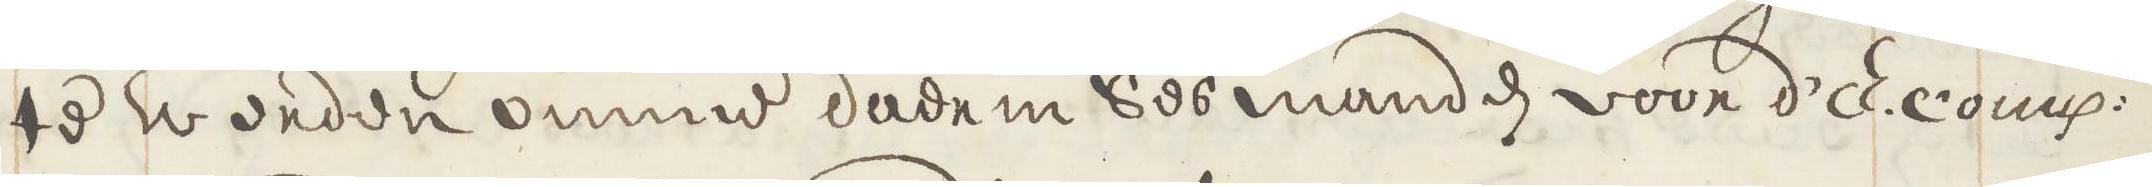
te werden omme daer in ses manden voor d’ E. comp:e
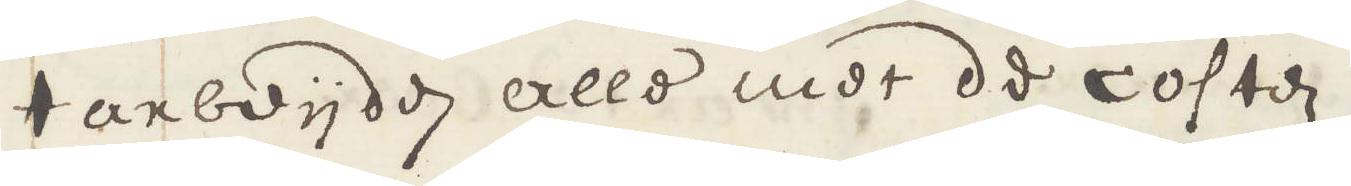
t arbeijden alle met de costen
